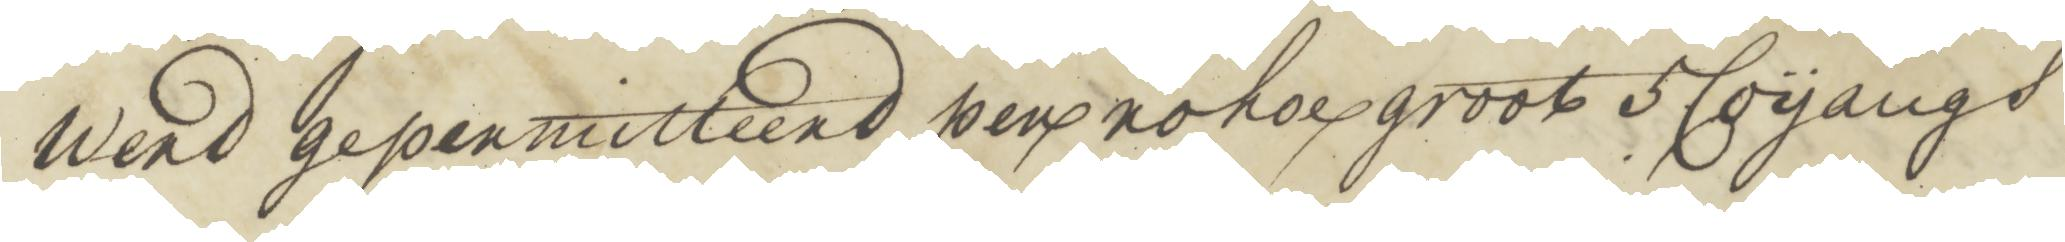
werd gepermitteerd per rokoe groot 5 Coijangs
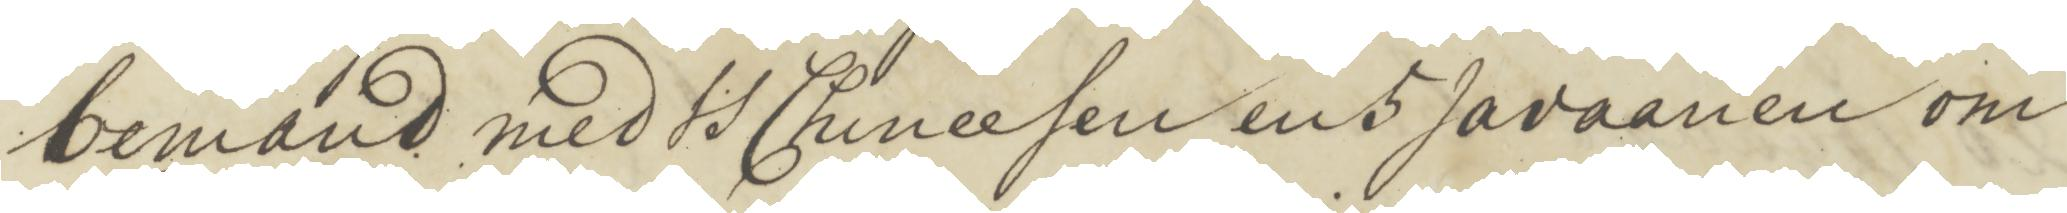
bemand med 11 Chineesen en 5 Javaanen om
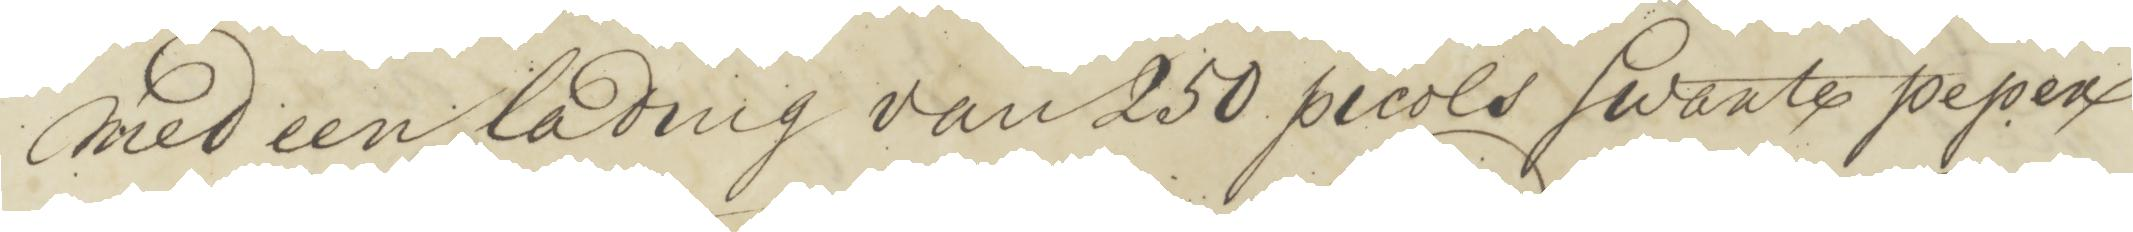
med een lading van 250 picols swarte peper
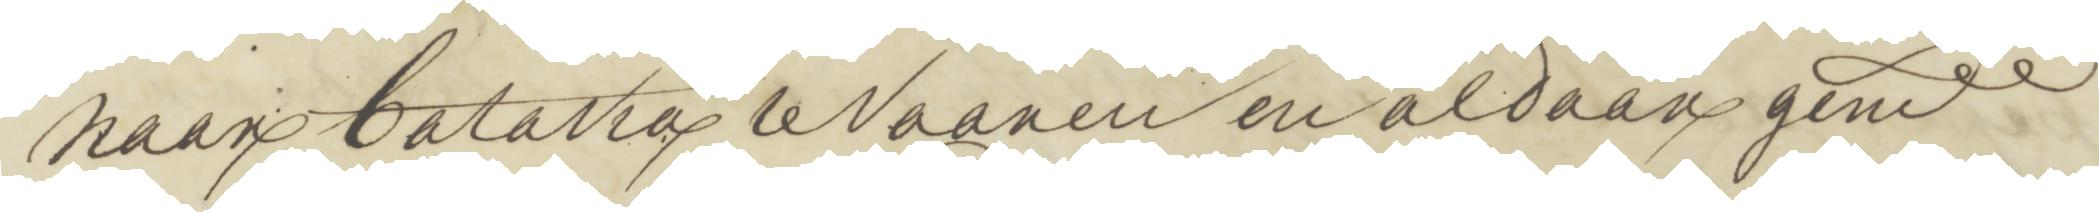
naar batavia tevaaren en aldaar gem
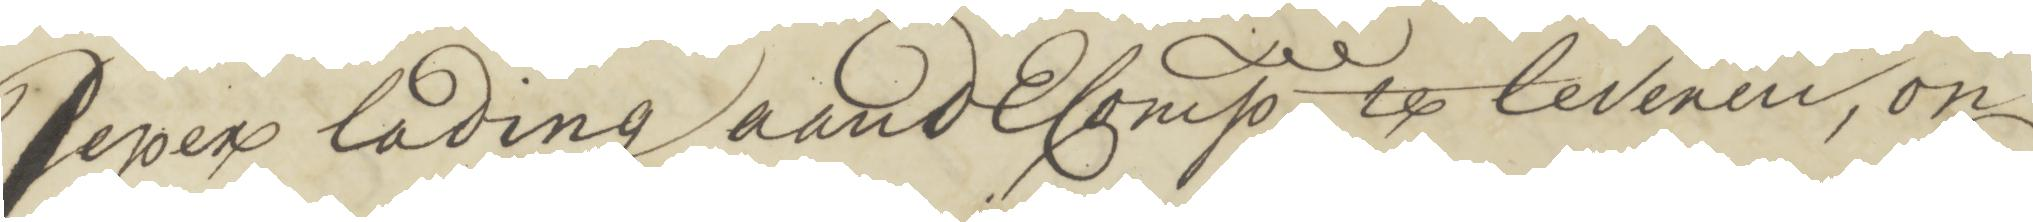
Peper lading aandEComp te leveren, on
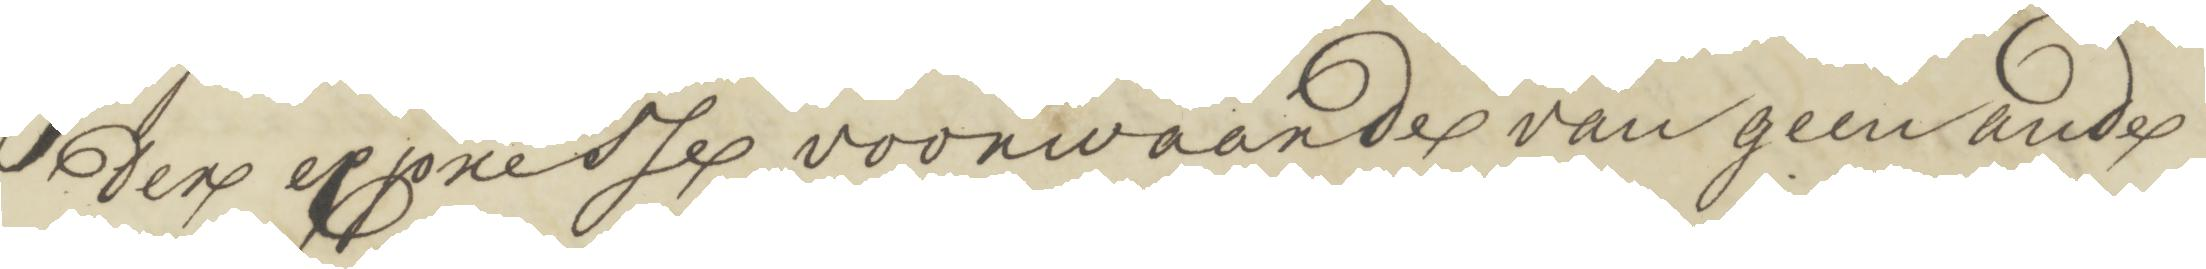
der expresse voorwaarde van geen ande
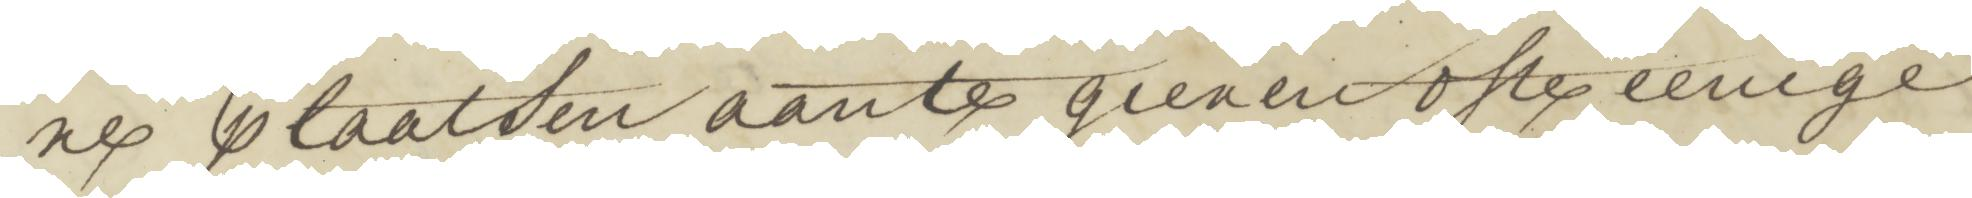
re plaatsen aante gieren ofte eenige
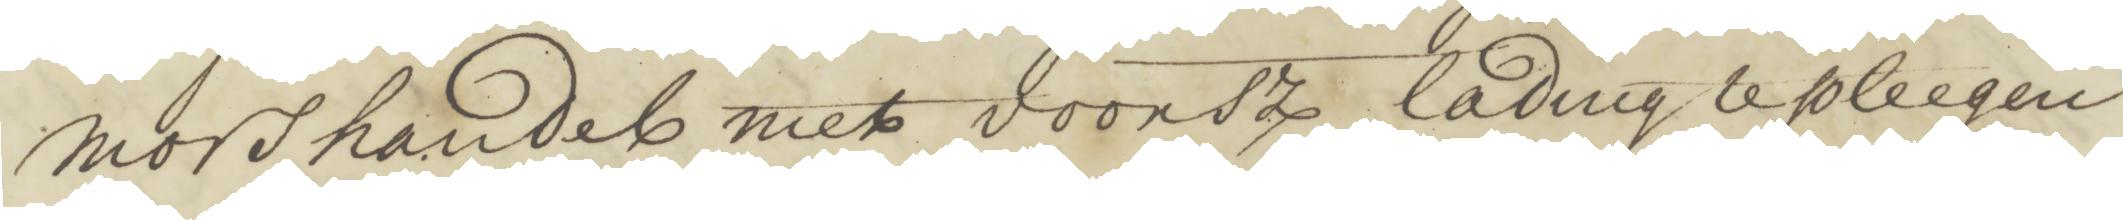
mors handel met voorsz lading te pleegen
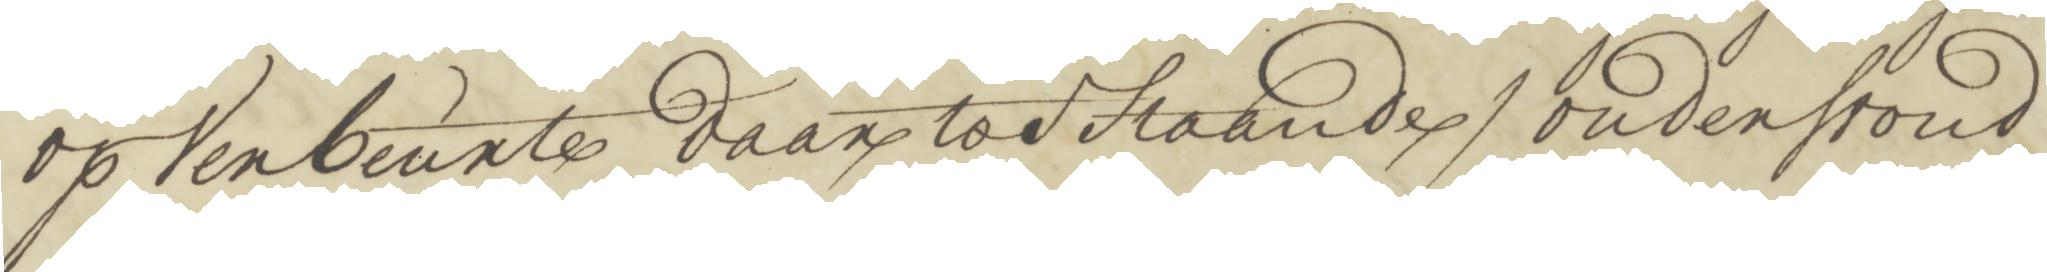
op Verbeurte daar toestaande /onderstond
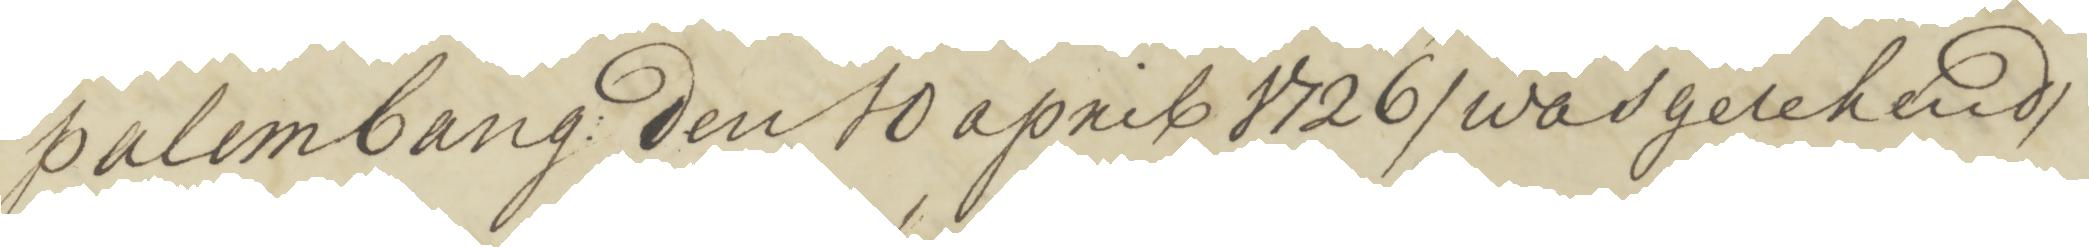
palembang: den 10 april 1726 /was getekend/
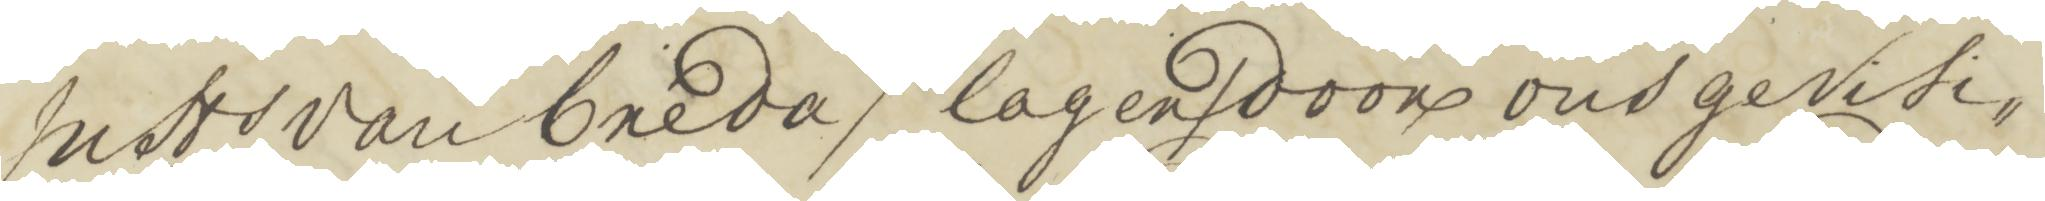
Justs van breda /lager/ door ons gevisi„
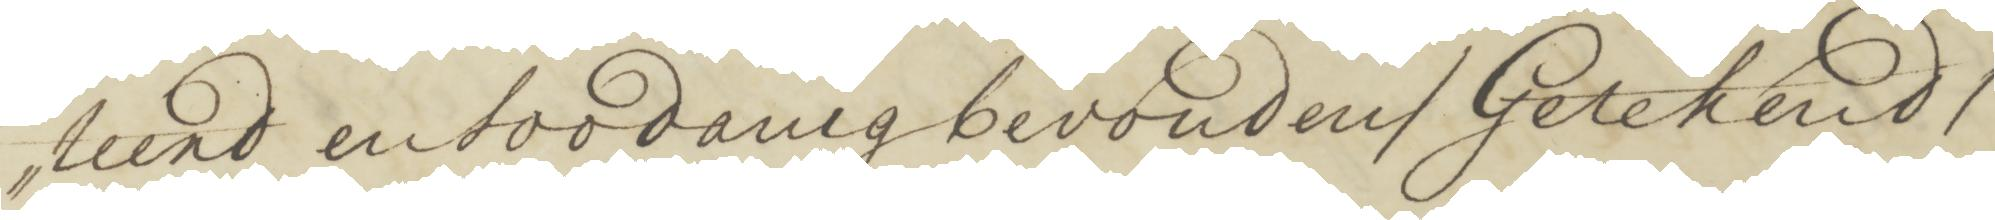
„teerd ensoodanig bevonden /Getekend/
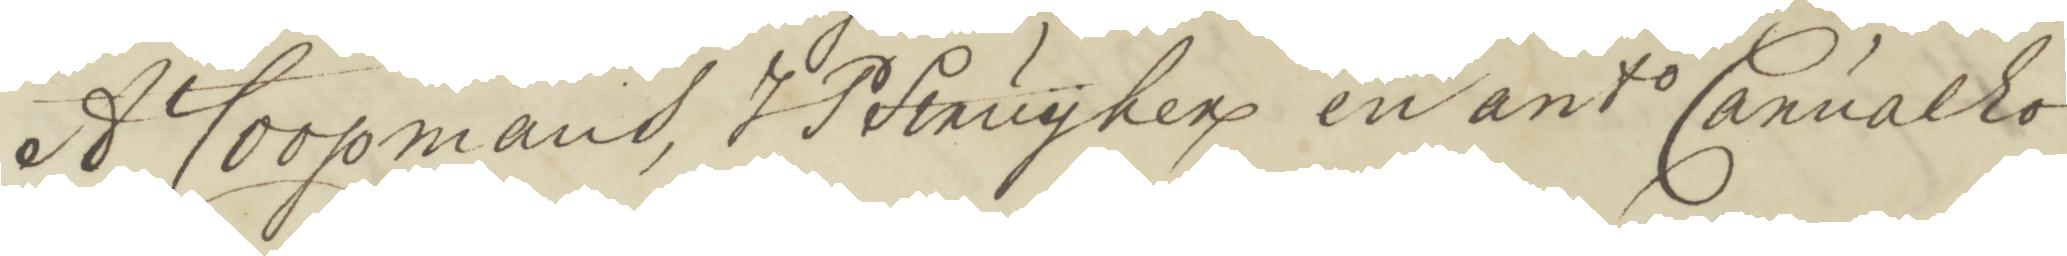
A Coopmans, I P Struijker en anto Carualho
